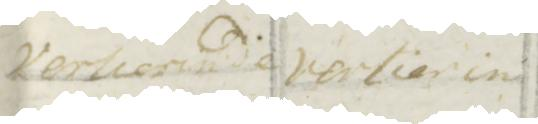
vertier in de vertier in
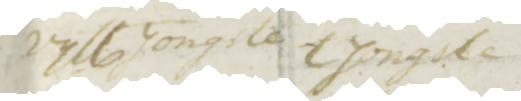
vijff Jongste t Jongste
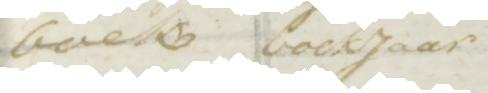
boek boek jaar
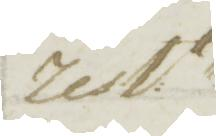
rest:t„
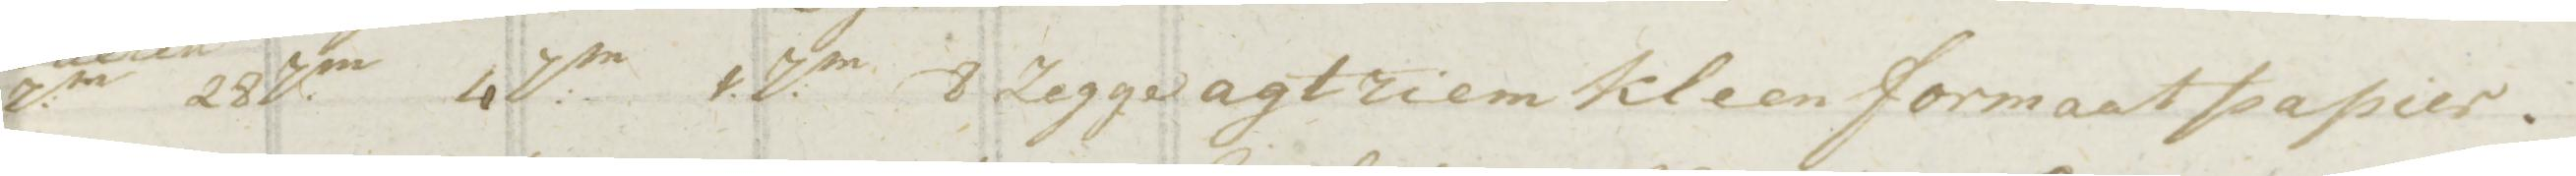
r:m 28r:m 4 r:m 1 r:m 8 Zegge agt riem kleen formaat papier.
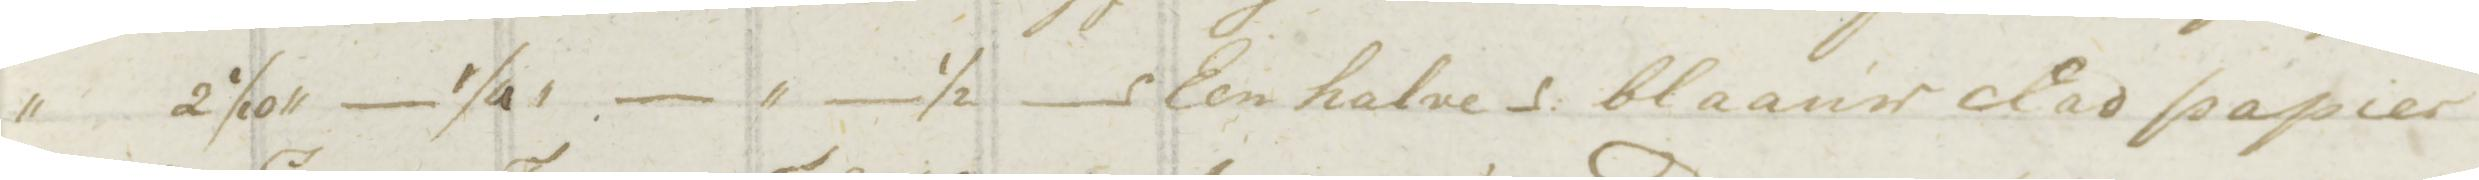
„ 2 1/10„ ¼„ — „ ½ — :' Een halve —:o blaauw clad papier
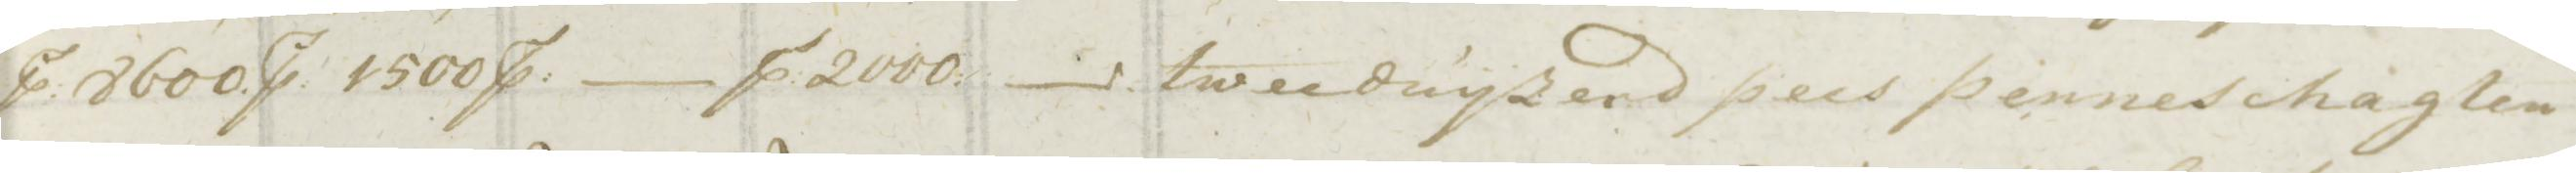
p:s 8600. p:s 1500 p:s — p:s 2000: _:' twee duijzend pees penneschagten
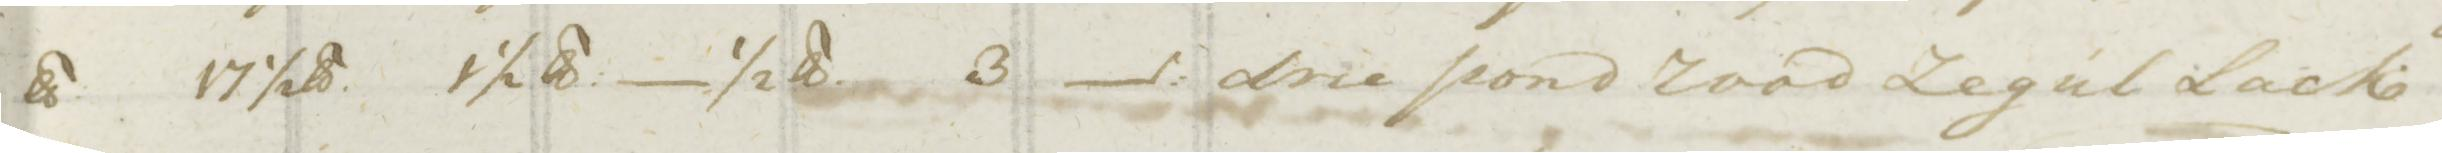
lb: 17½ lb. 1½ lb: — ½ lb. 3 _:' drie stond rood Zegul Lack
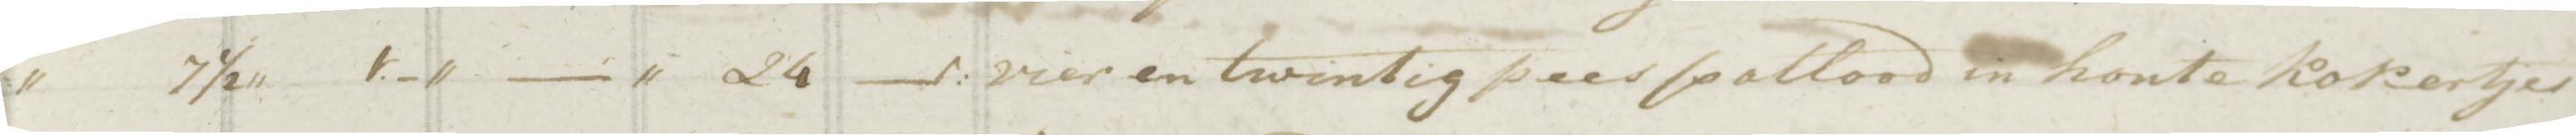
„ 7½„ 1.-„ — „ 24 _:' vier en twintig pees pallood in houte kokertjes
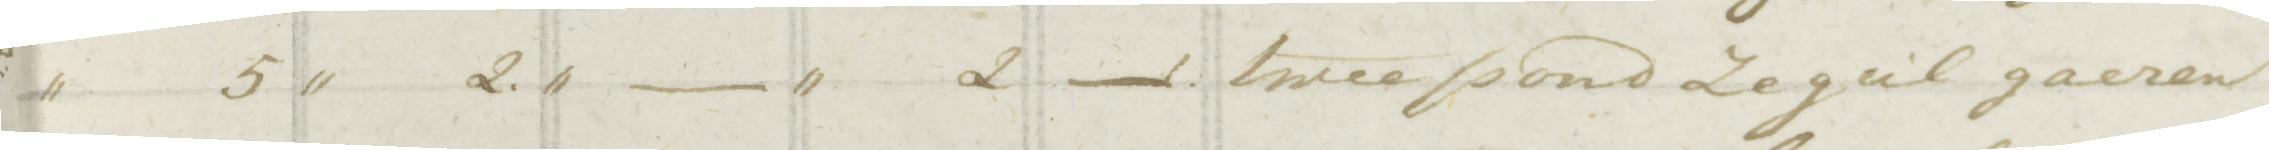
„ 5 „ 2. „ — „ 2 —:' twee pond zegul gaeren
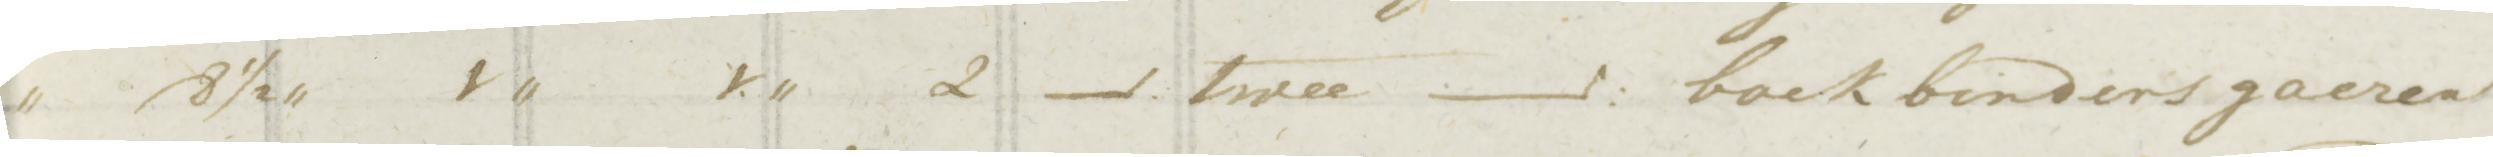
„ 8½ „ 1„ 1„ 2 —: twee —:' boek binders gaeren
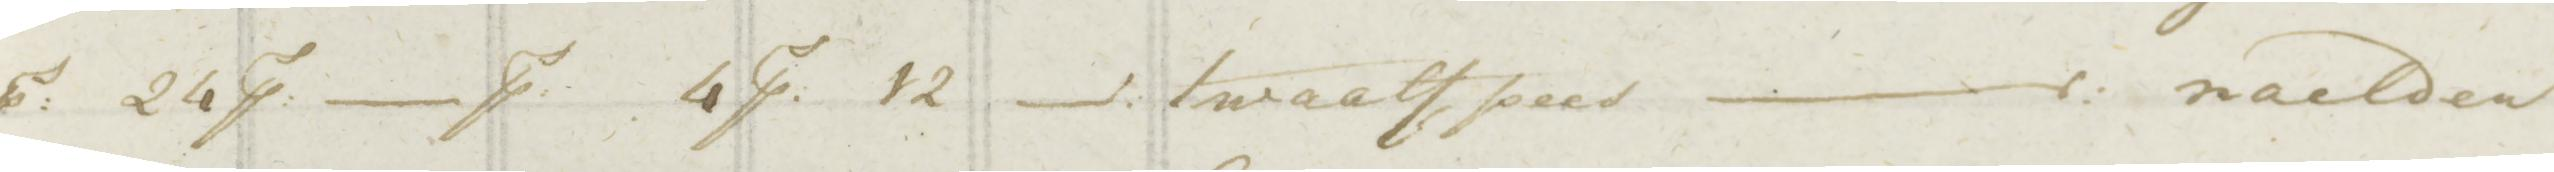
p:s 24 p:s — p:s 4 p:s 12 —:' twaalf pees —: ' naelden
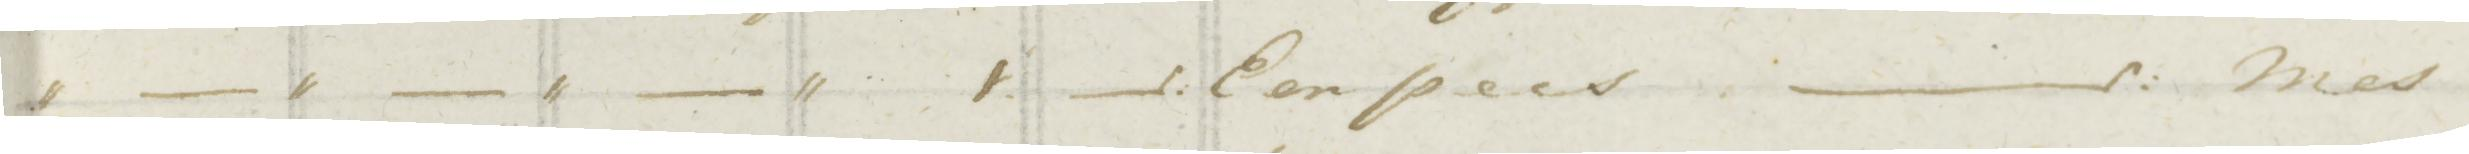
„ „ „ „ 1. —: Een pees —: mes
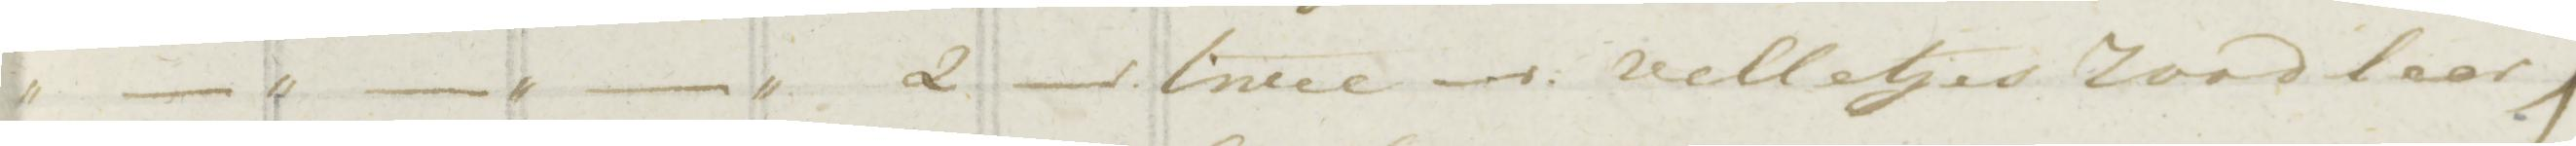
„— „ —„ — „ 2 —:' twee —: velletjes Rood leer
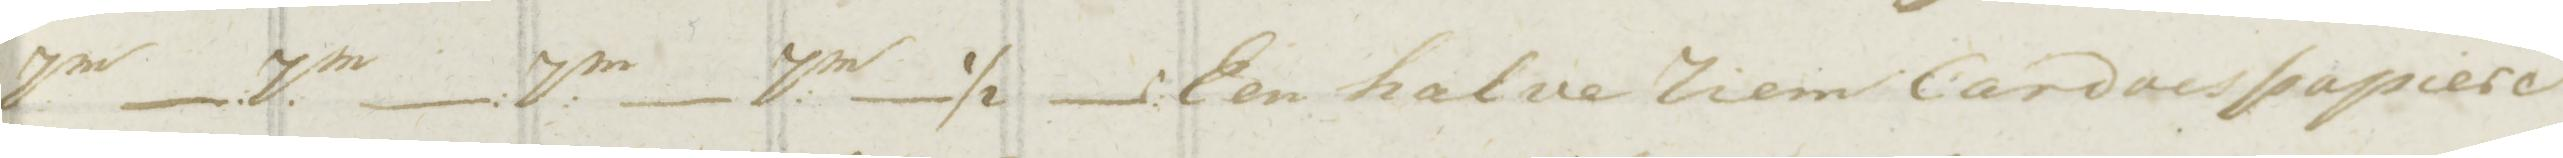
r:m —r:m — r:m — r:m— ½ —:' Een halve riem Cardoes papiere
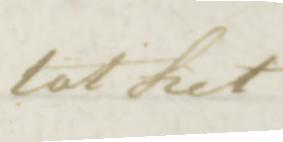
tot het
